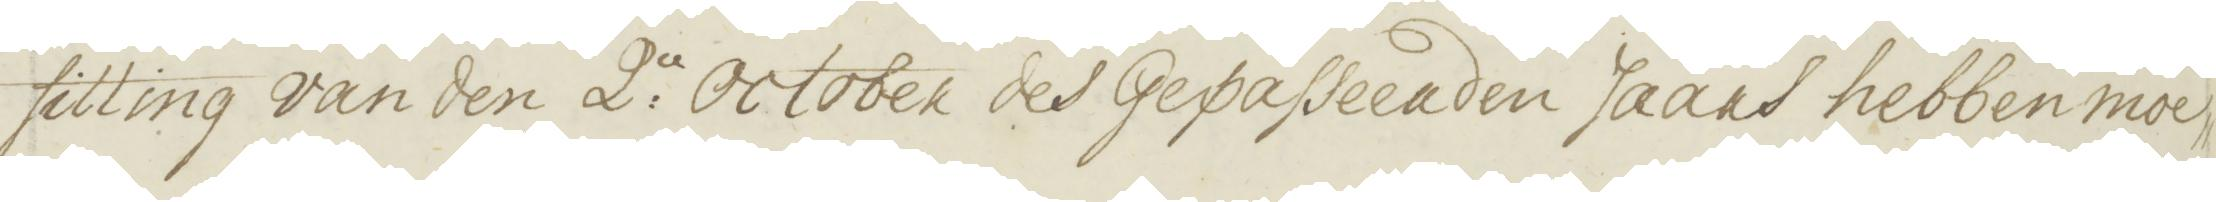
sitting van den 2:' October des gepasseerden Jaars hebben moe„
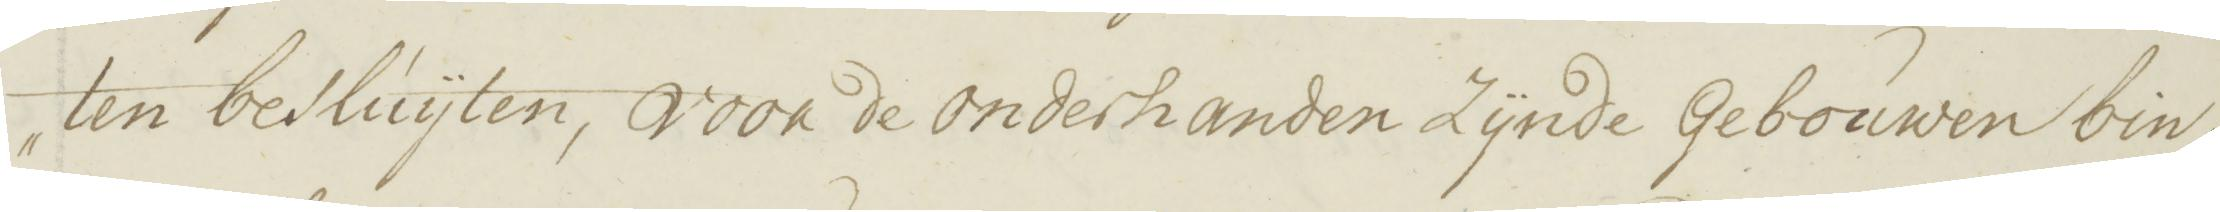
„ten besluijten, voor de onderhanden zijnde gebouwen bin
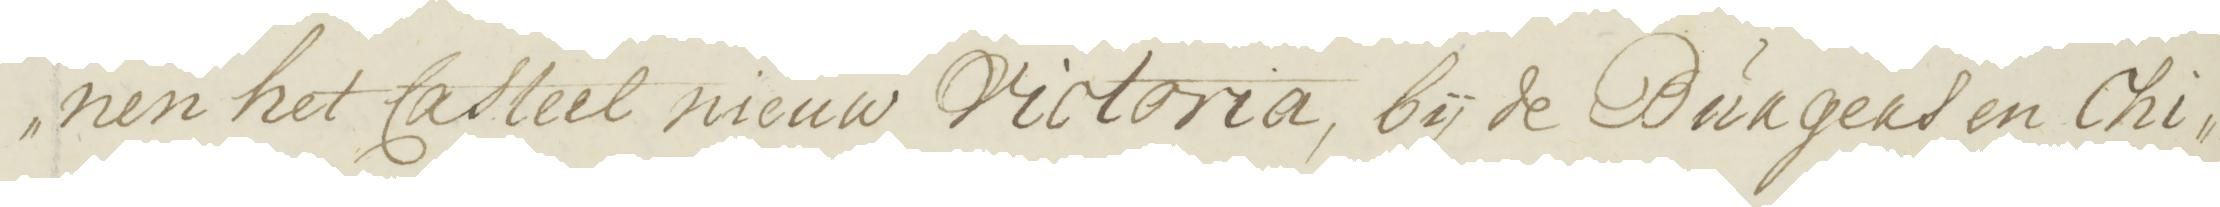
„nen het Casteel nieuw Victoria, bij de Burgers en Chi„
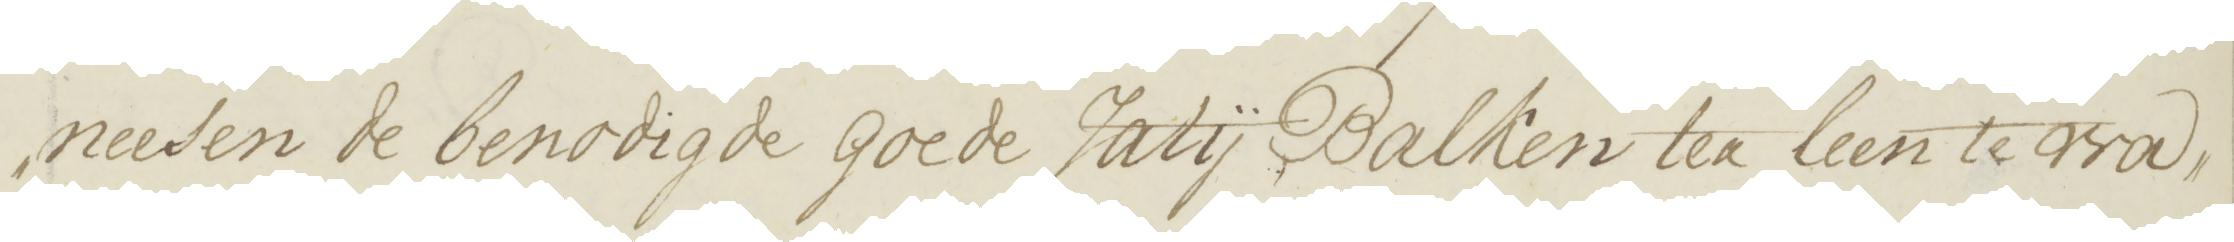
„neesen de benodigde goede Jatij Balken ter leen te wa„
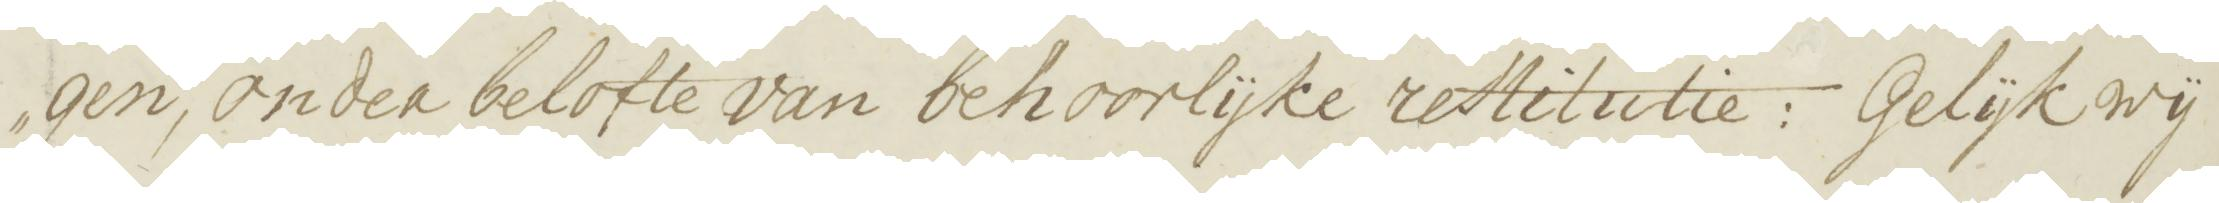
„gen, onder belofte van behoorlijke restitutie: gelijk wij
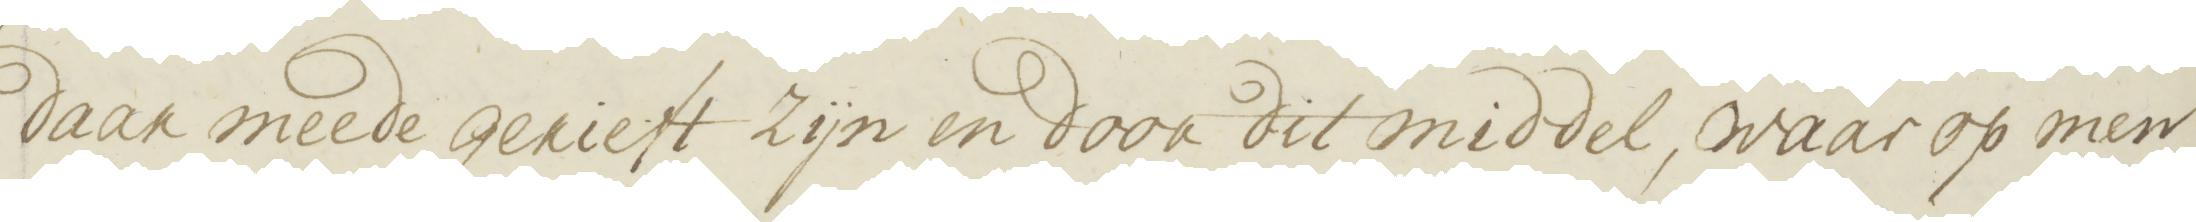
daar meede gerieft zijn en door dit middel, waar op men
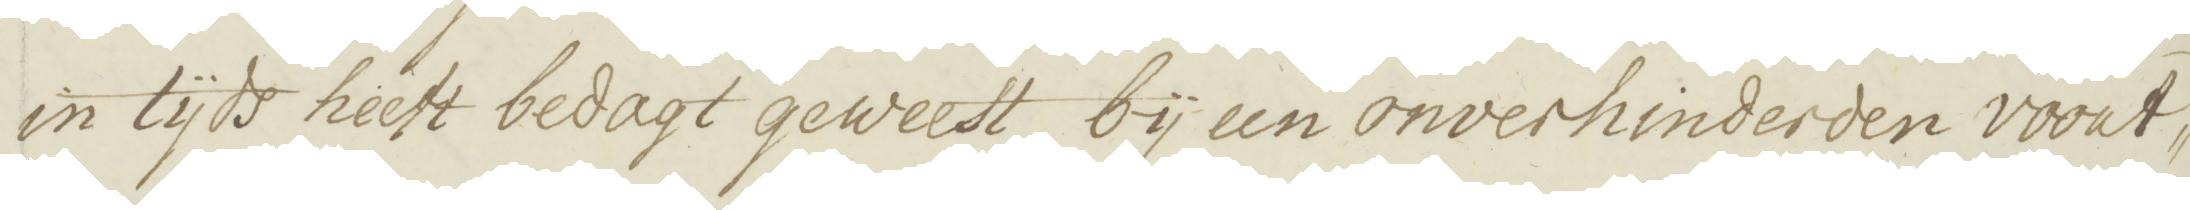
in tijds heeft bedagt geweest bij een onverhinderden voort
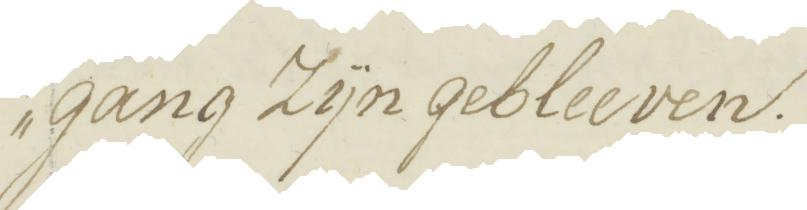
„gang zijn gebleeven.
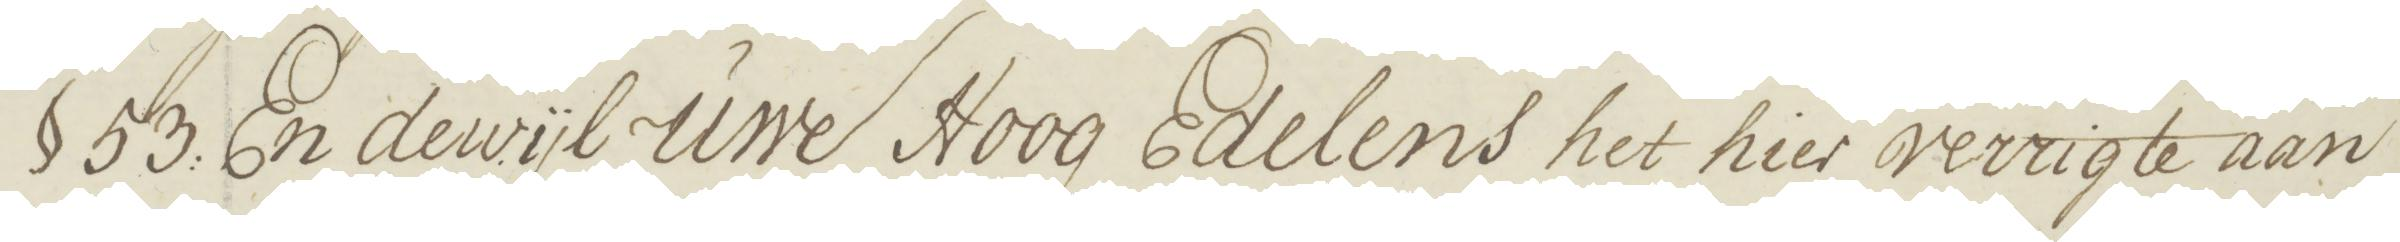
§ 53: En dewijl uwe Hoog Edelens het hier verrigte aan
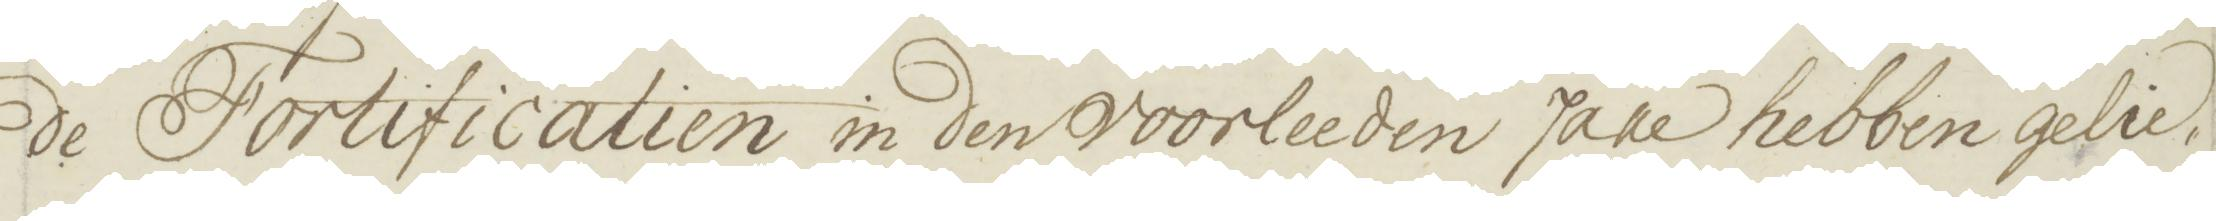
de Fortificatien in den voorleeden Jare hebben gelie„
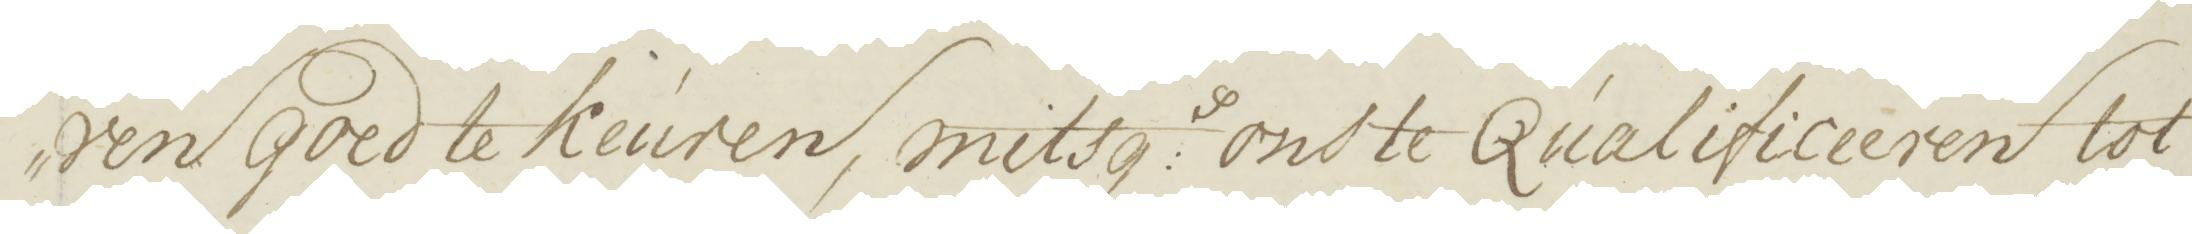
„ven goed te keuren, mitsg:s ons te Qualificeeren tot
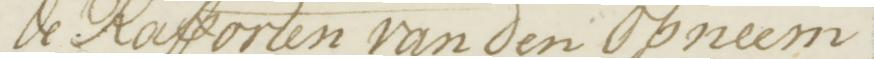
de Rapporten van den opneem
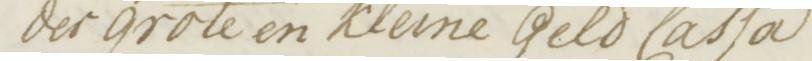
der grote en kleine geld Cassa
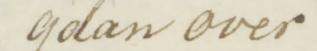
gaan over
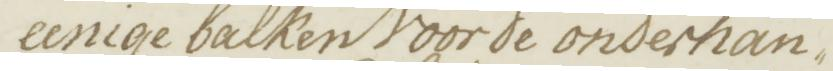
eenige balken voor de onderhan„
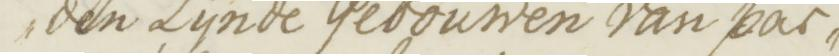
„den zijnde Gebouwen van par„
